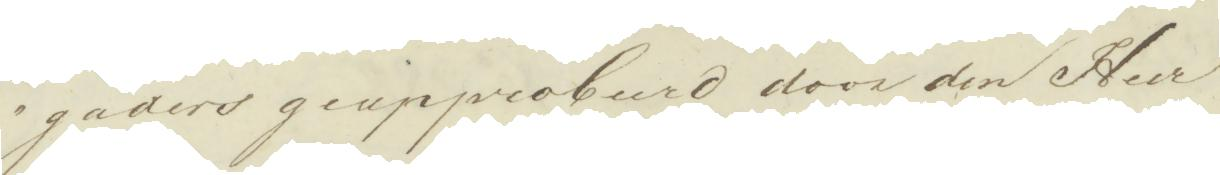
„gaders geapprobeerd door den Heer
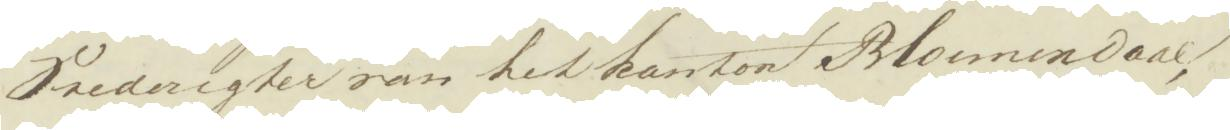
Vrederegter van het kanton Bloemendaal,
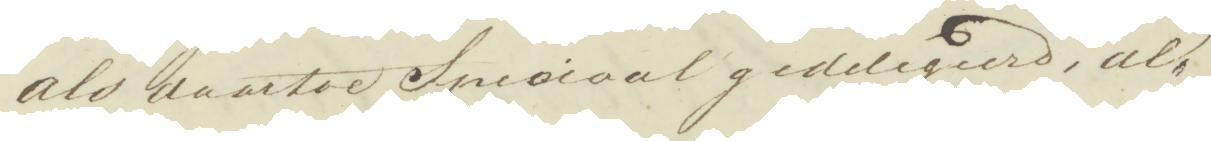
als daartoe Speciaal gedelegeerd, al
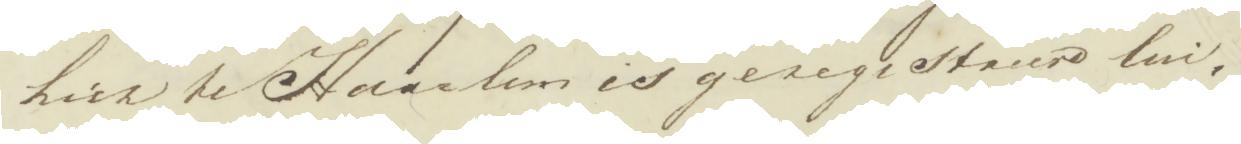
hier te Haarlem is geregistreerd lui„
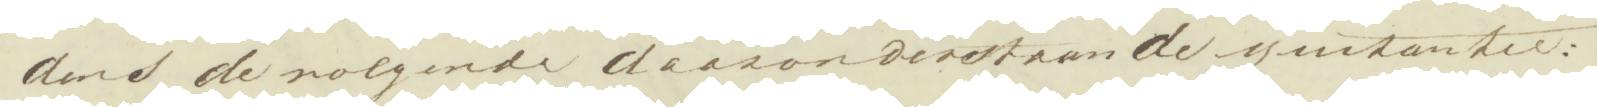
dens de volgende daaronderstaande quitantie:
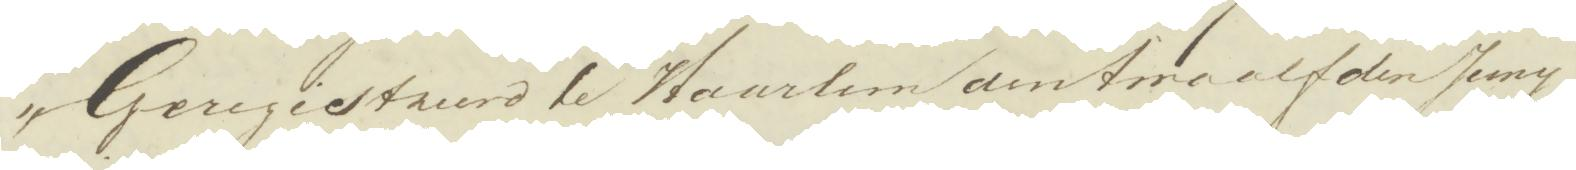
„ Geregistreerd te Haarlem den twaalfden Juny
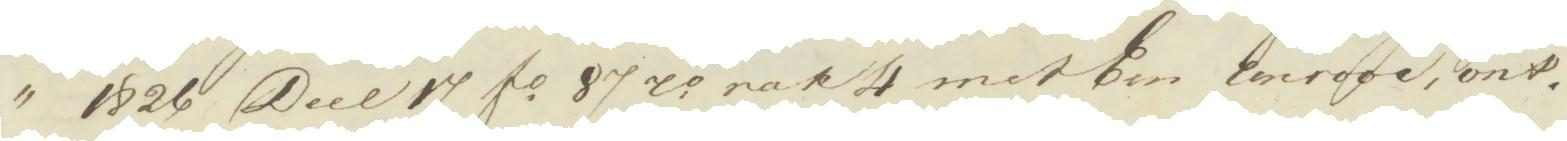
„ 1826 Deel 17 f:o 87 r:o vak 4 met Een renvooi, ont„
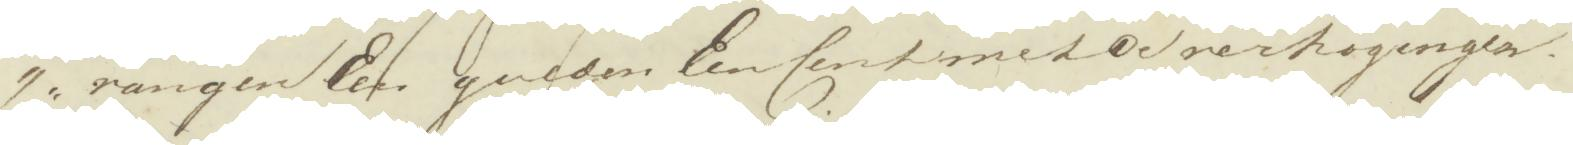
„vangen Een gulden Een Cent met de verhogingen
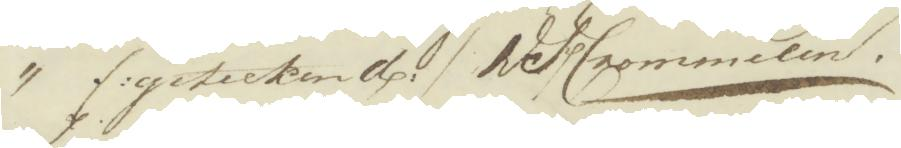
„ /:geteekend :/ DF Crommelin.
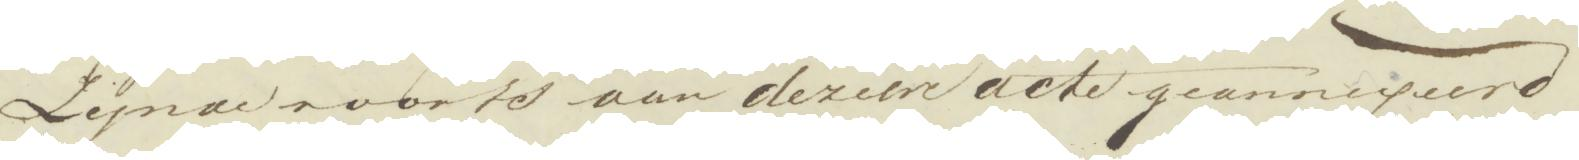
Zijnde voorts aan dezelve acte geannexeerd
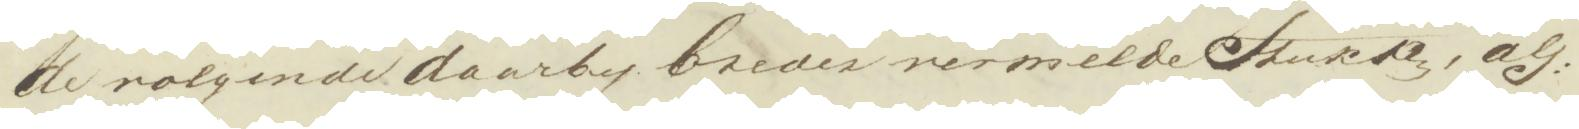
de volgende daarby breder vermelde Stukken, als:
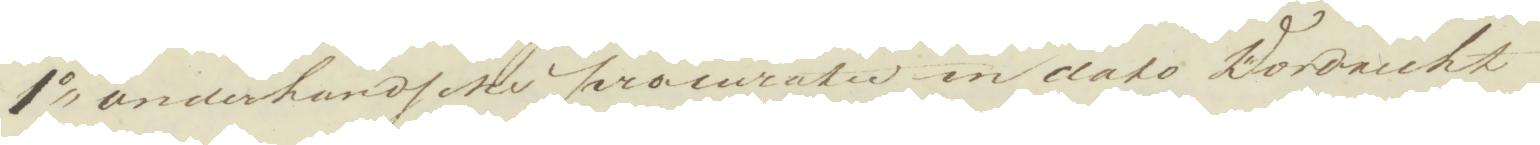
1=o onderhandsche procuratie in dato Dordrecht
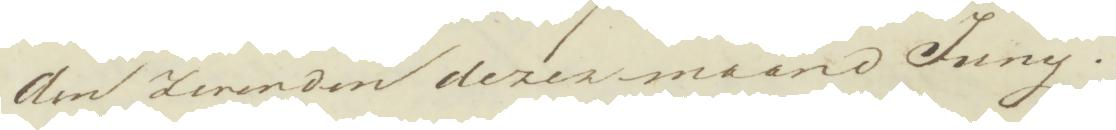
den zevenden dezer maand Junij.
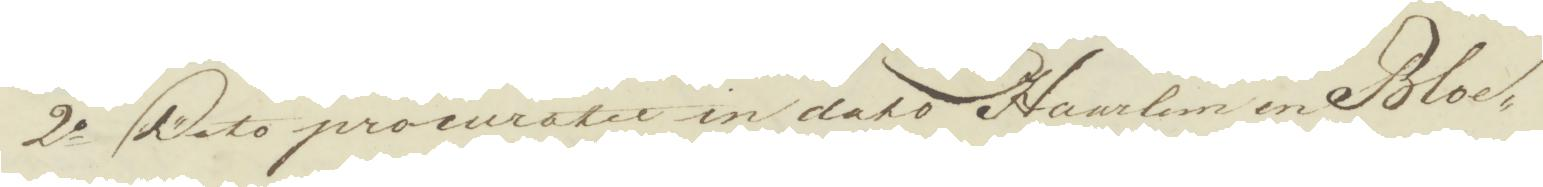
2=o Dito procuratie in dato Haarlem en Bloe„
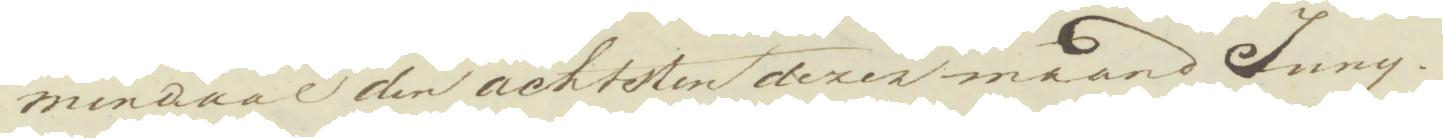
=mendaal den achtsten dezer maand Juny.
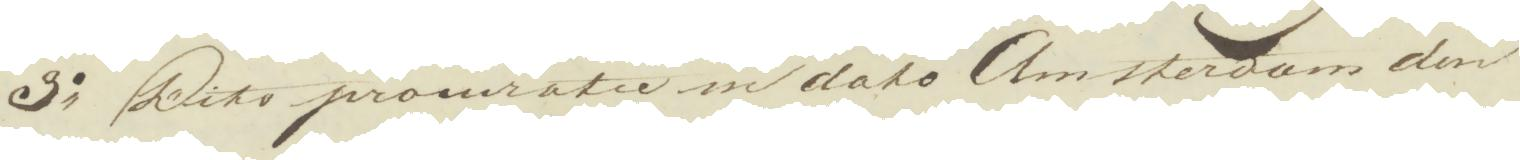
3=o Dito procuratie in dato Amsterdam den
